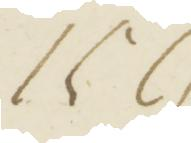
159
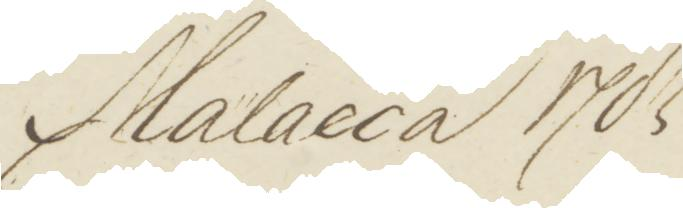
Malacca 1785
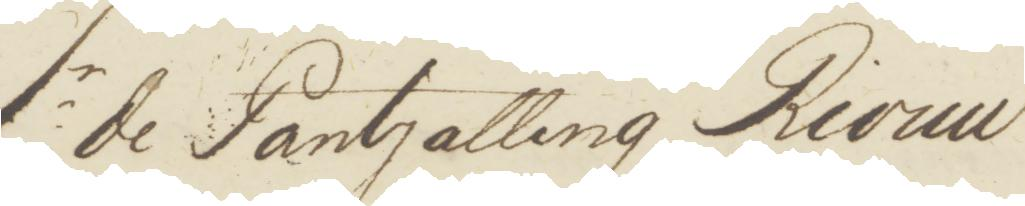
T:r de Pantjalling Riouw
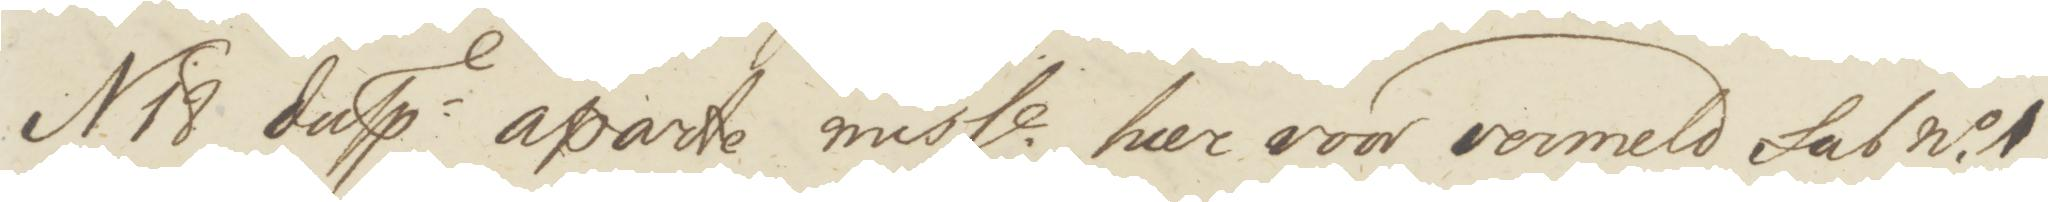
N18 dupp:e aparte miss:e hier voor vermeld sal n.o 1
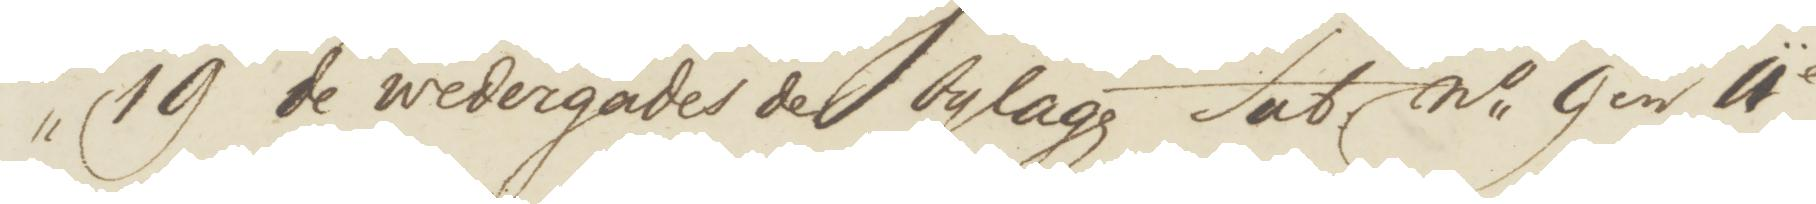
„19 de wedergades der bijlagen fab: n:o gen 11e
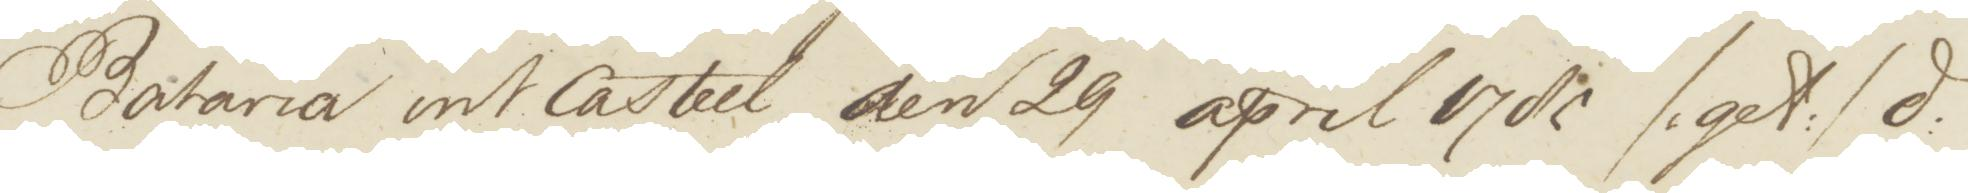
Batavia in t Casteel den 29 april 1785 /:get:/ d:
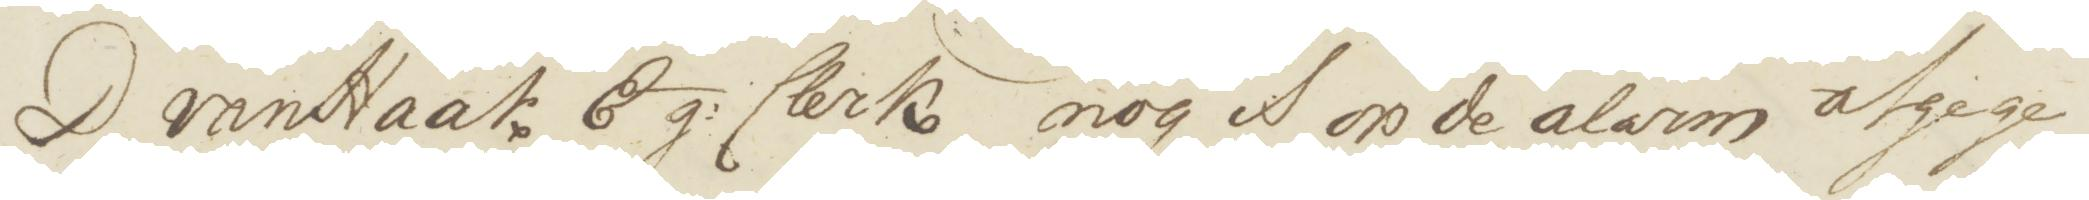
D van Haak Eg: Clerk nog is op de alarm afgege
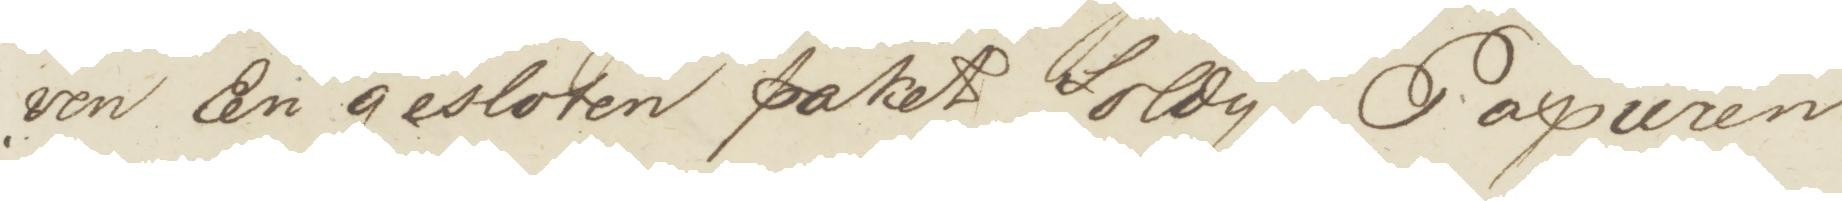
ven Een gesloten paket soldy Papieren
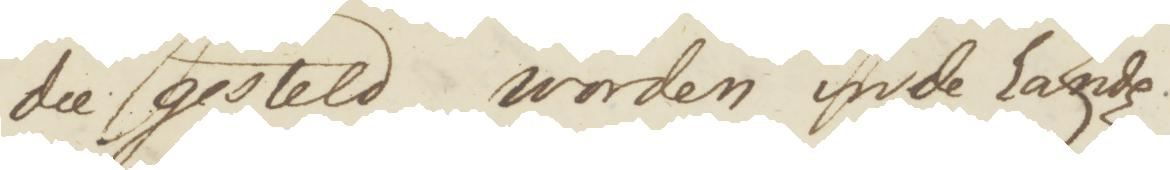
die gesteld worden inde handen:
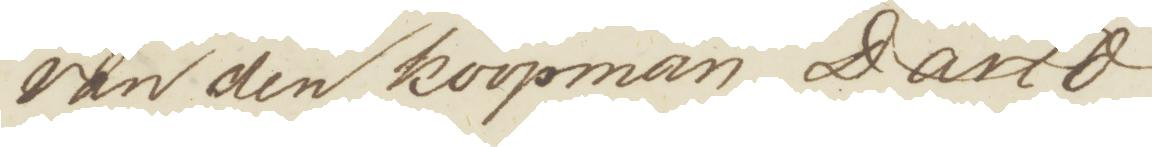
van den koopman David
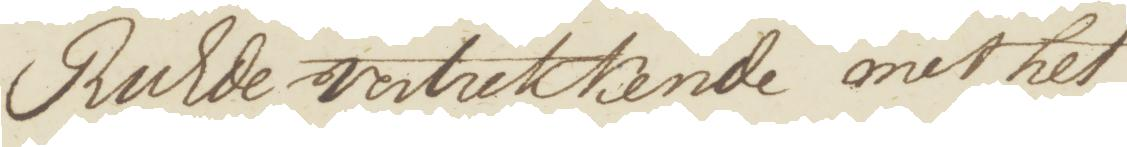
Ruhde vertrekkende met het
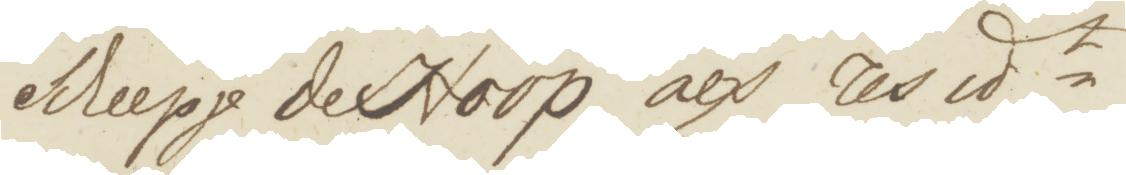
scheepje de Hoop als resid=t
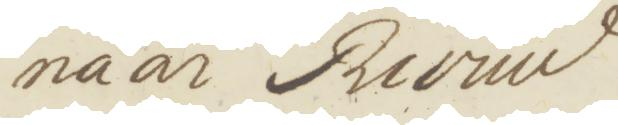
naar Riouw
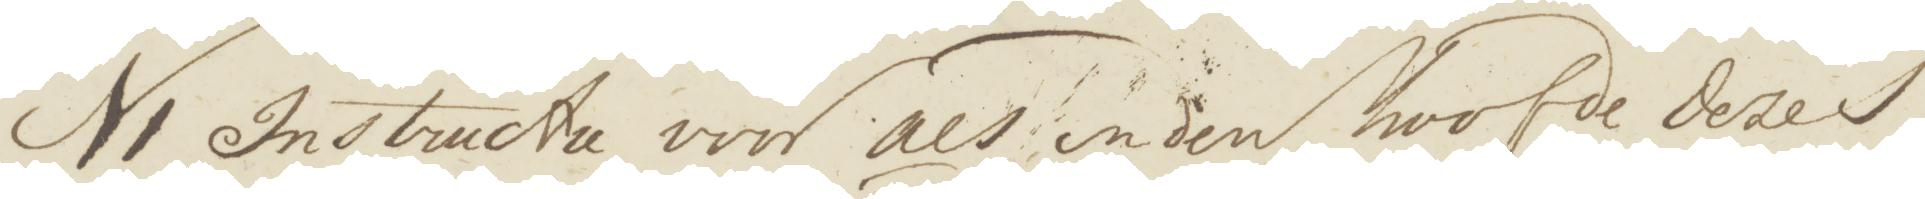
N1 Instructie voor als in den hoofde dezes
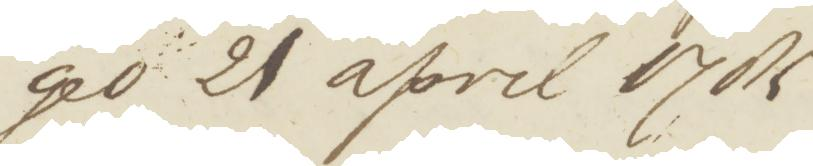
ged 21 april 1785
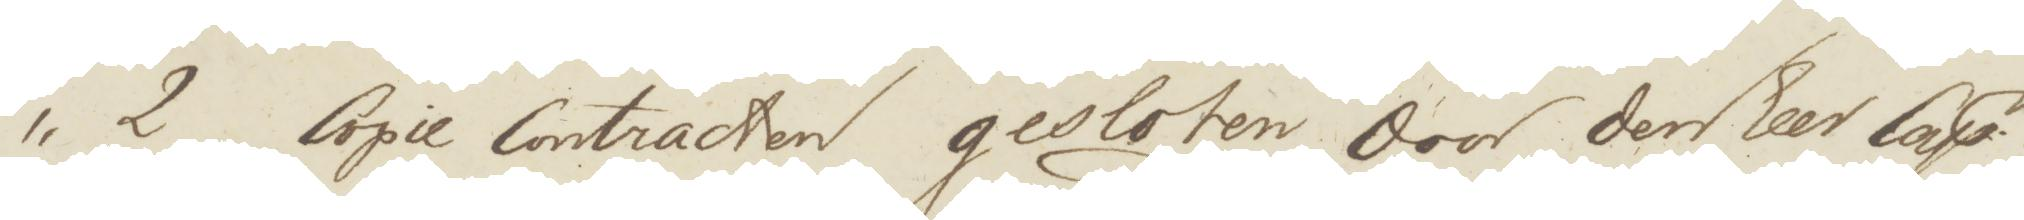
„ 2 Copie Contracten gesloten door den heer Cap:n
